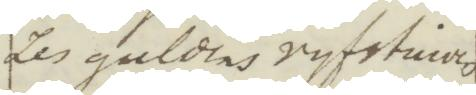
zes guldens vyf stuivrs
